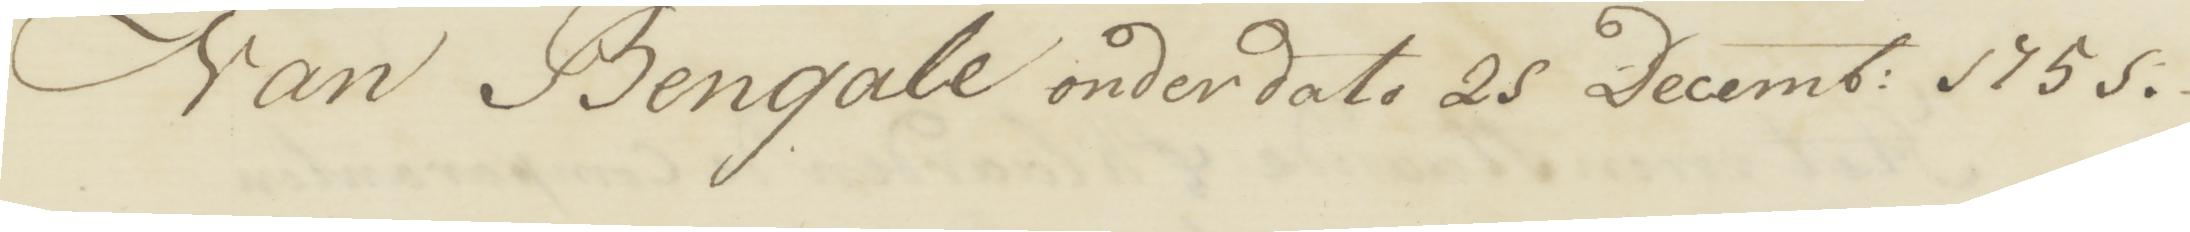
Van Bengale onder dato 25 Decemb: 1751.
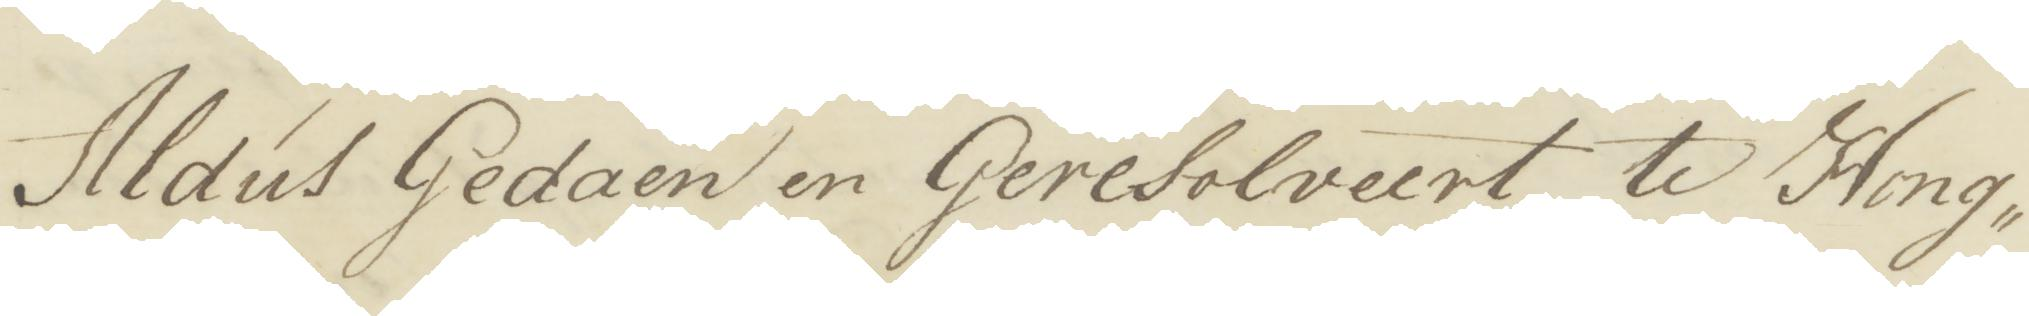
Aldus Gedaen en Geresolveert te Houg„
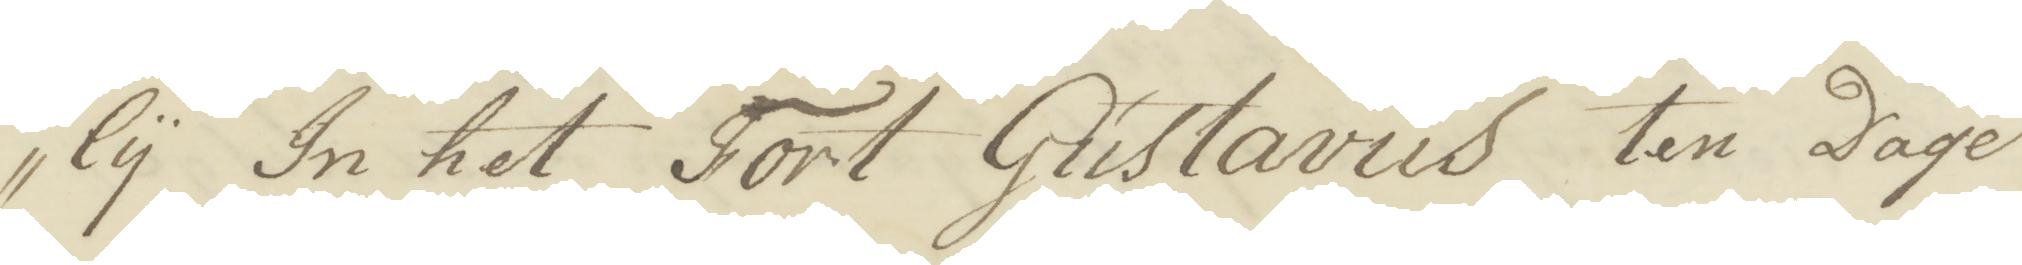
„lij In het Fort Gustavus ten Dage
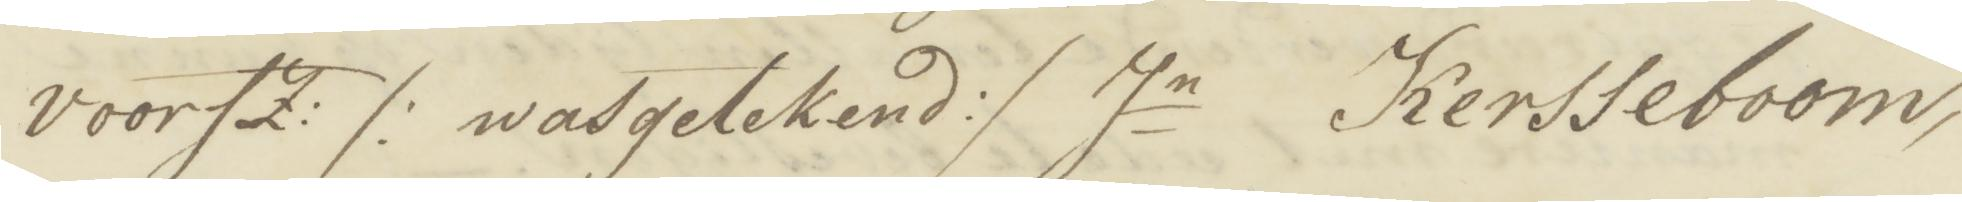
voorsz: /:was getekend:/ J=n Kersseboom,
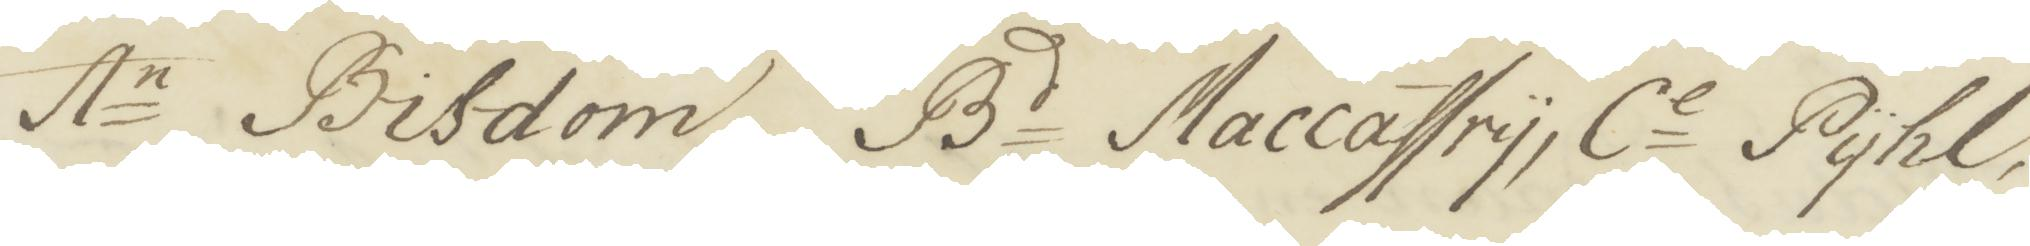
A=n Bisdom, B=d Maccaffrij, C=l Pijhl,
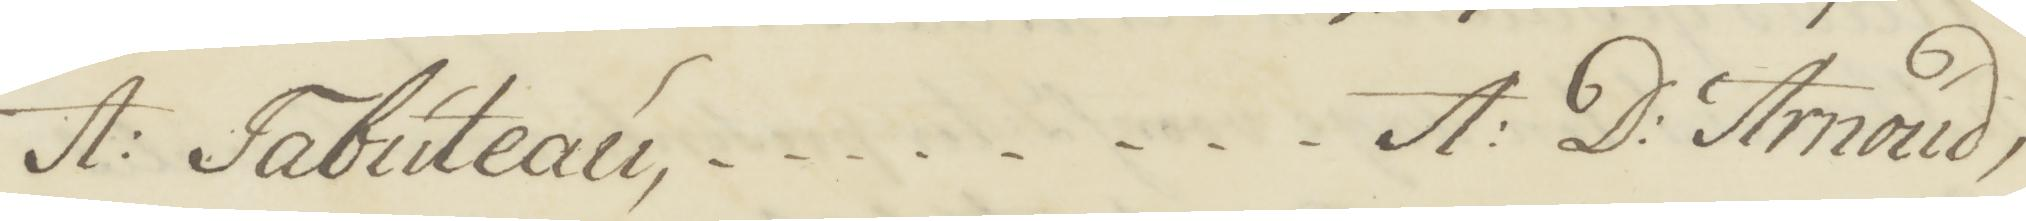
A: Tabuteau, . . . . . . . . A: D:'Arnoud,
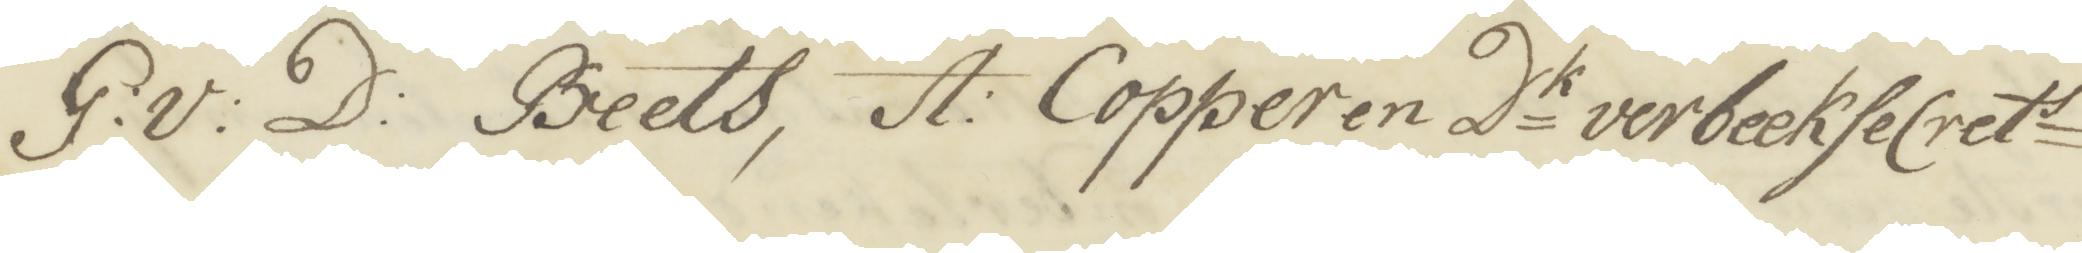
G: v: D: Beets, A: Copper en D=k verbeek Secret=s
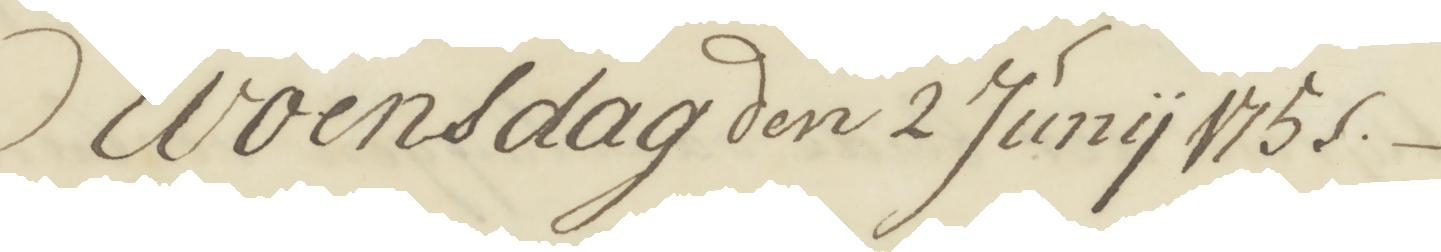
woensdag den 2 Junij 1751.—
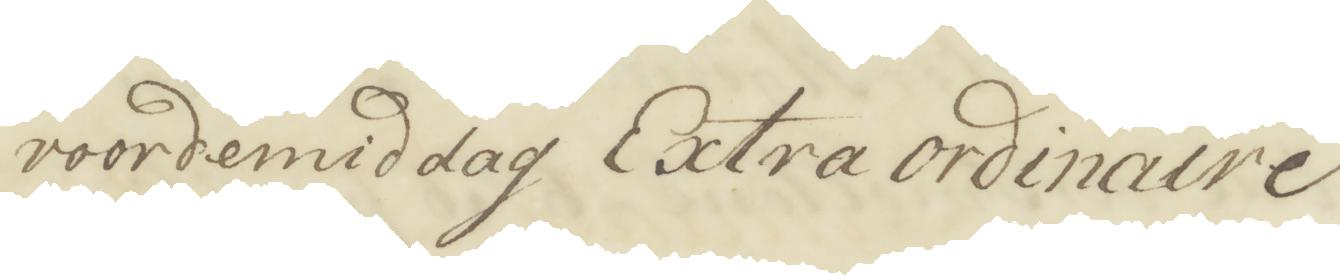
voordemiddag Extra ordinaire
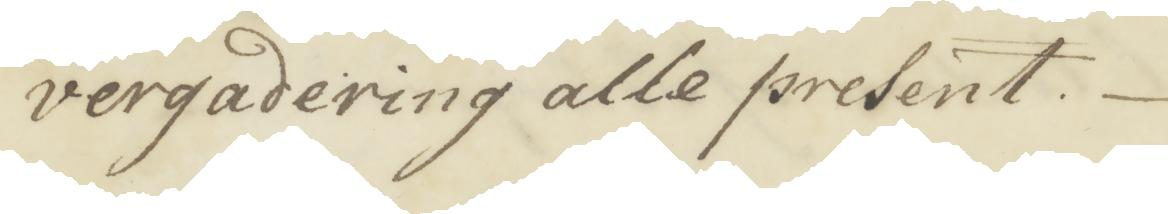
vergadering alle present.—
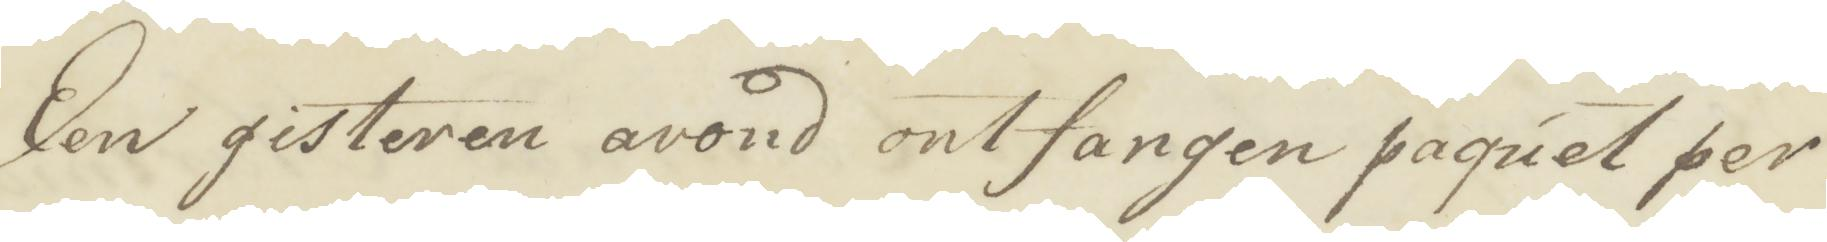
Een gisteren avond ontfangen paquet per
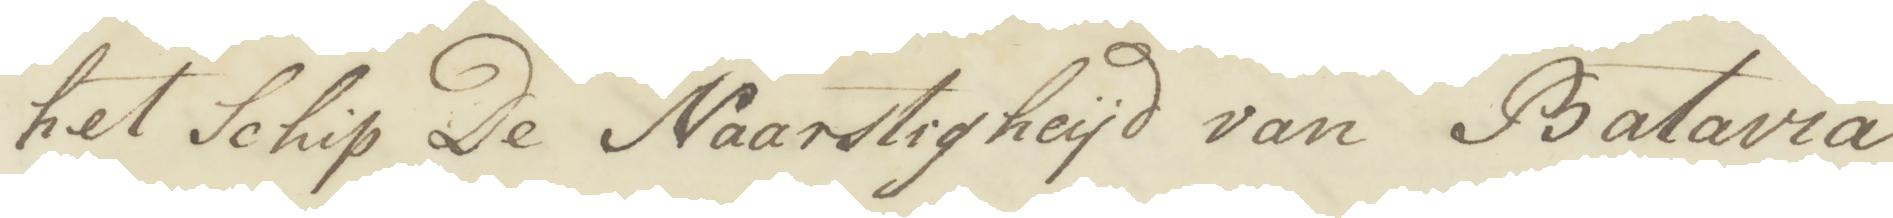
het Schip De Naarstigheijd van Batavia
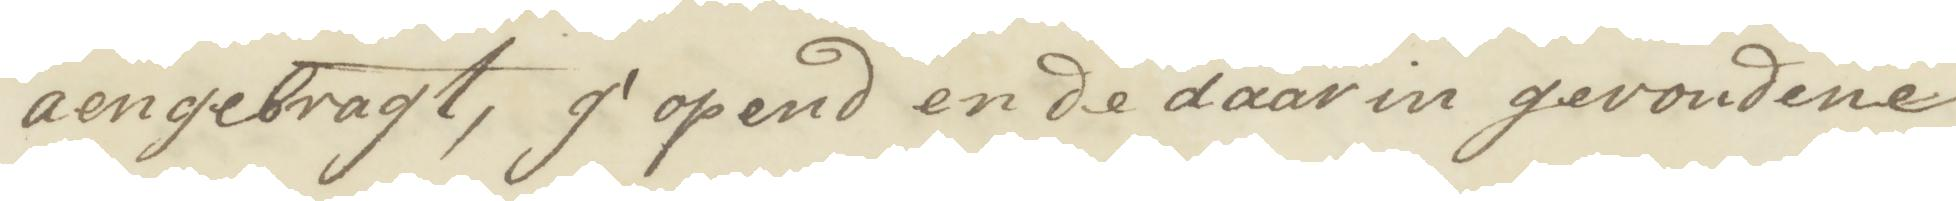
aengebragt, g’opend en de daar in gevondene
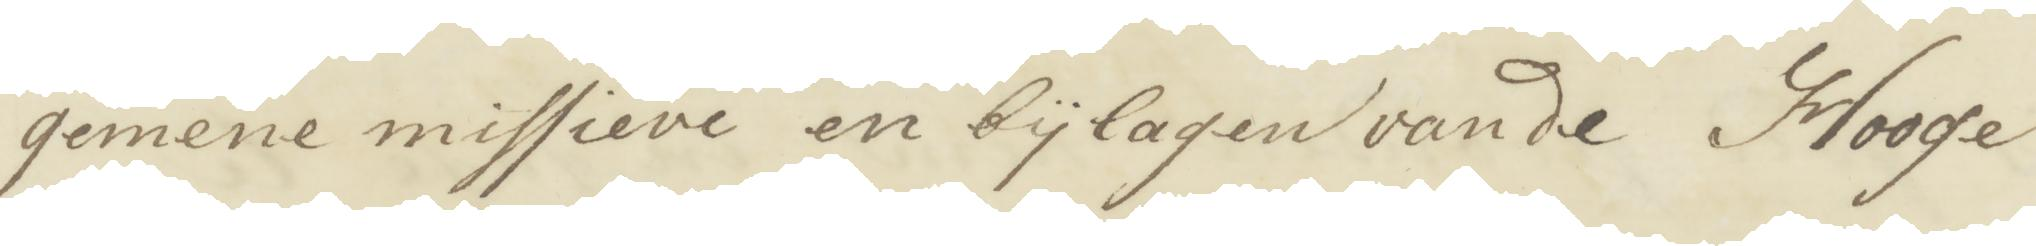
gemene missieve en bijlagen van de Hooge
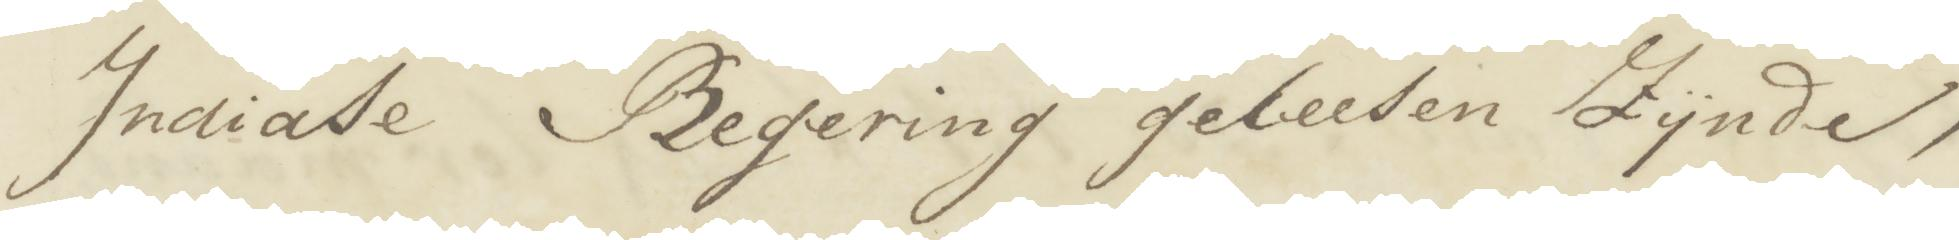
Jndiase Regering geleesen Zijnde,
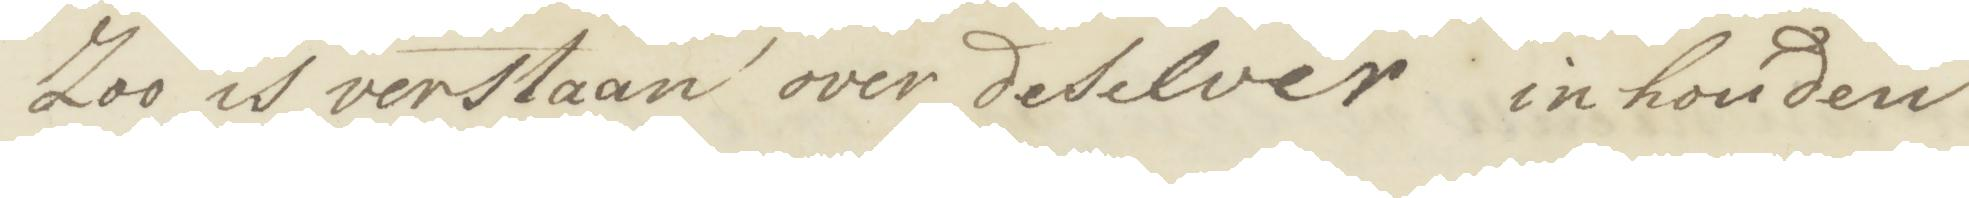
Zoo is verstaan over deselver in houden
